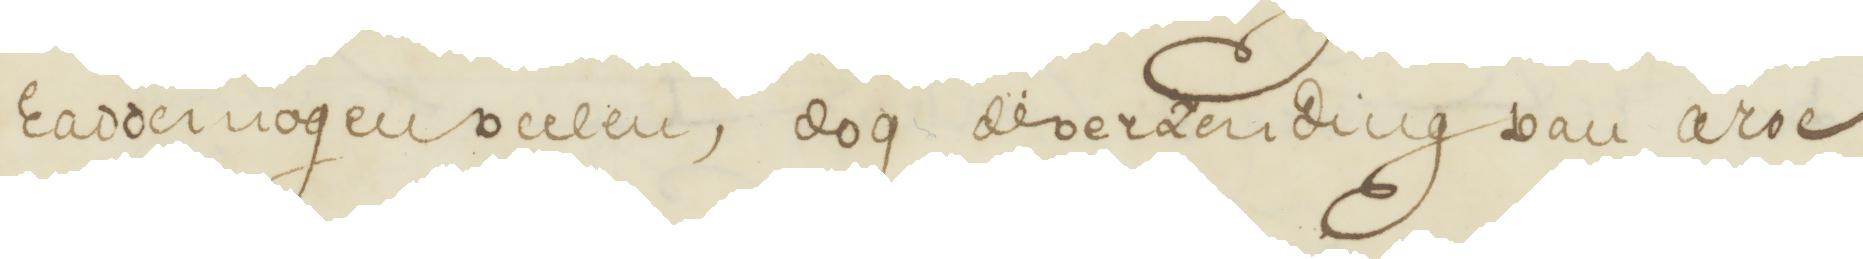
haddemogen veelen, dog de verzending van aroe
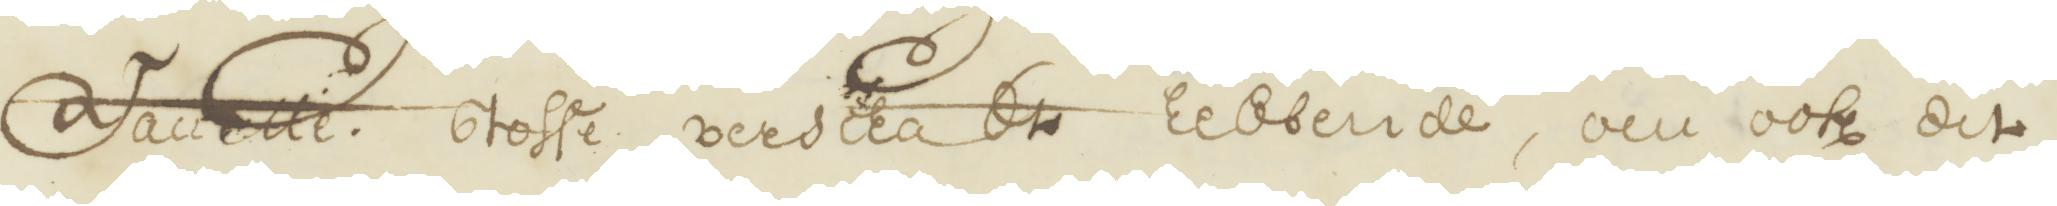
Tanette. stoffe verschaft hebbende, om ook dit
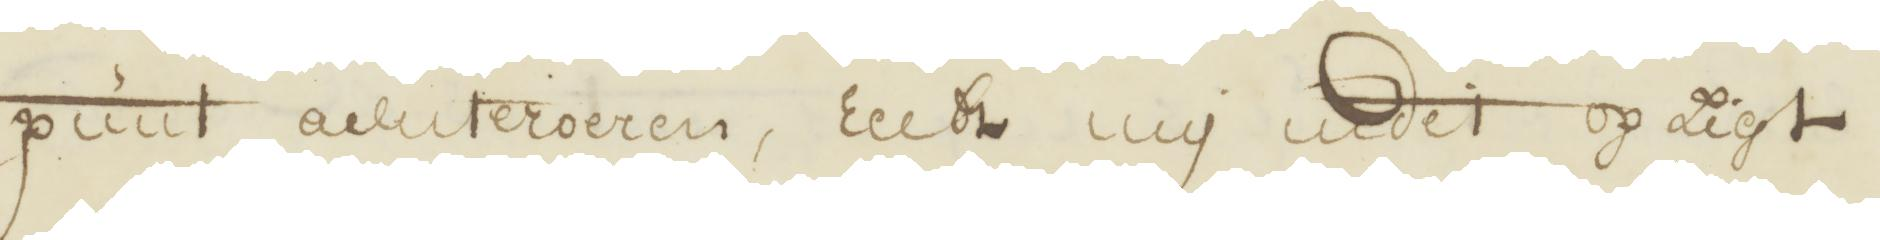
punt aenteroeren, heeft mij indit op zigt
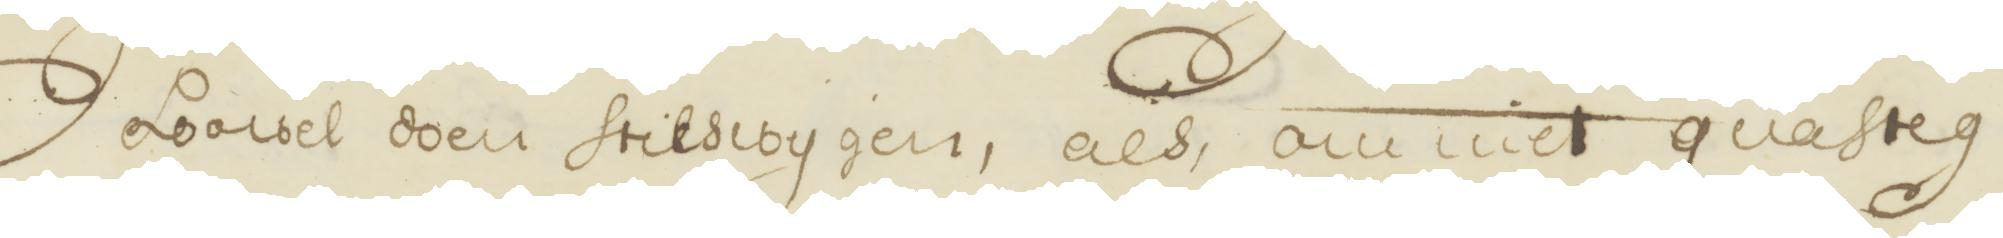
soowel doen stilzwijgen, als, om niet quastig
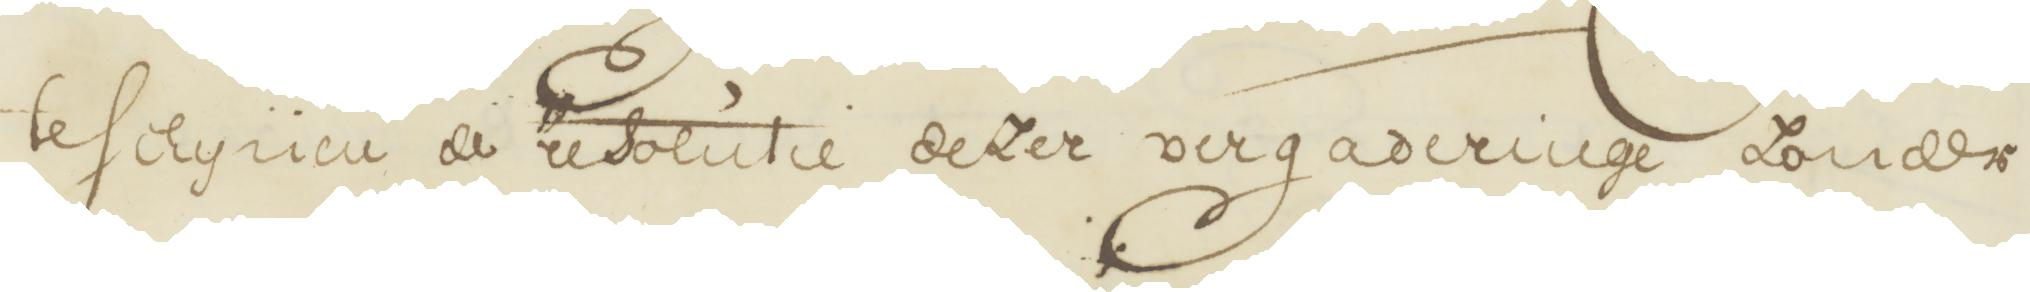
te schijnen de resolutie dezer vergaderinge zonder
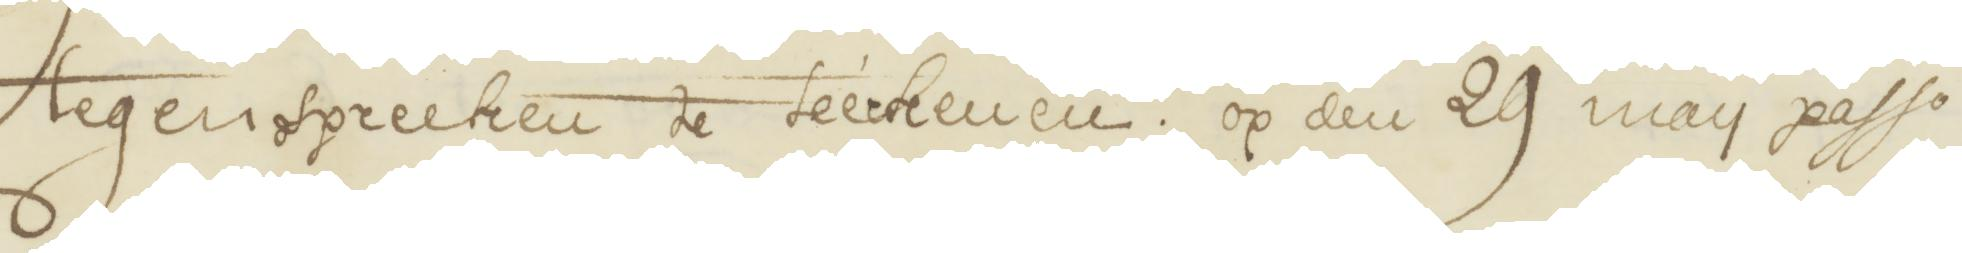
tegen spreeken te teeckenen. op den 29' maij passo
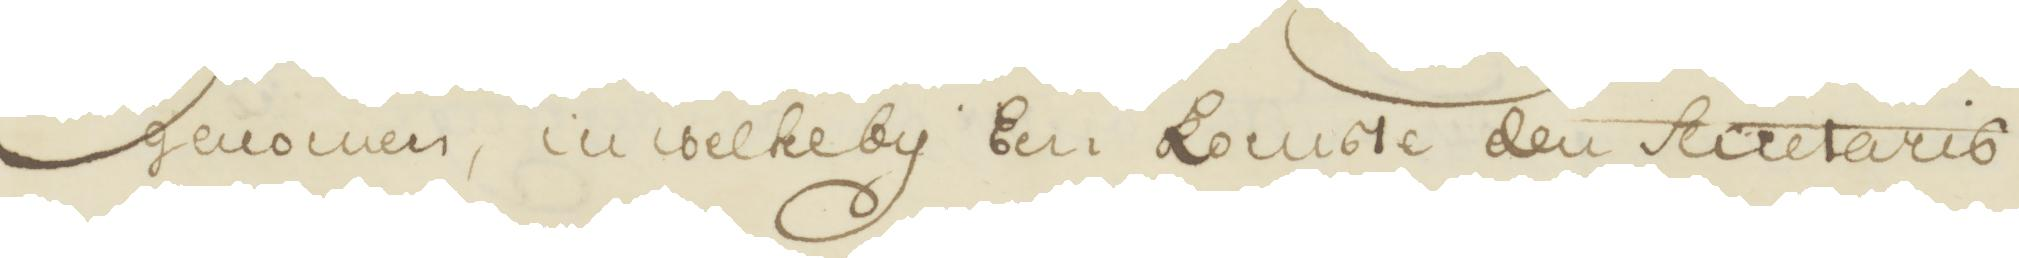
genomen, in welke bij Een komste den secetaris
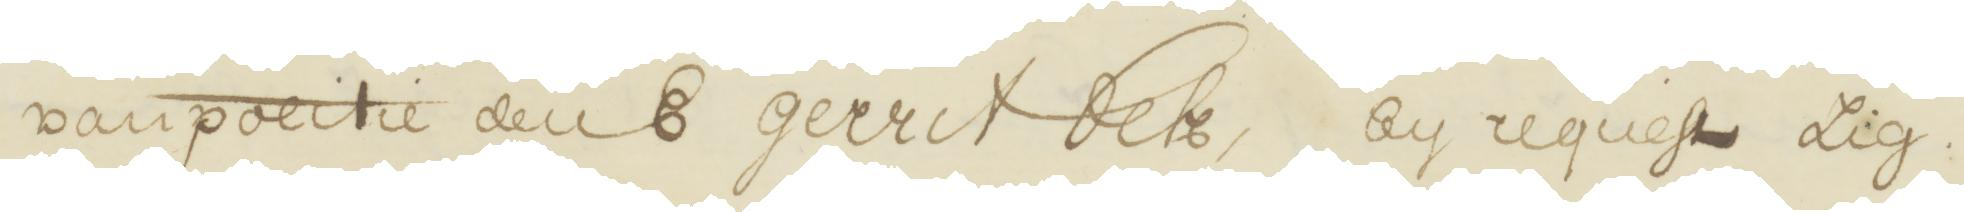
van politie den E gerrit fek, bij request zig.
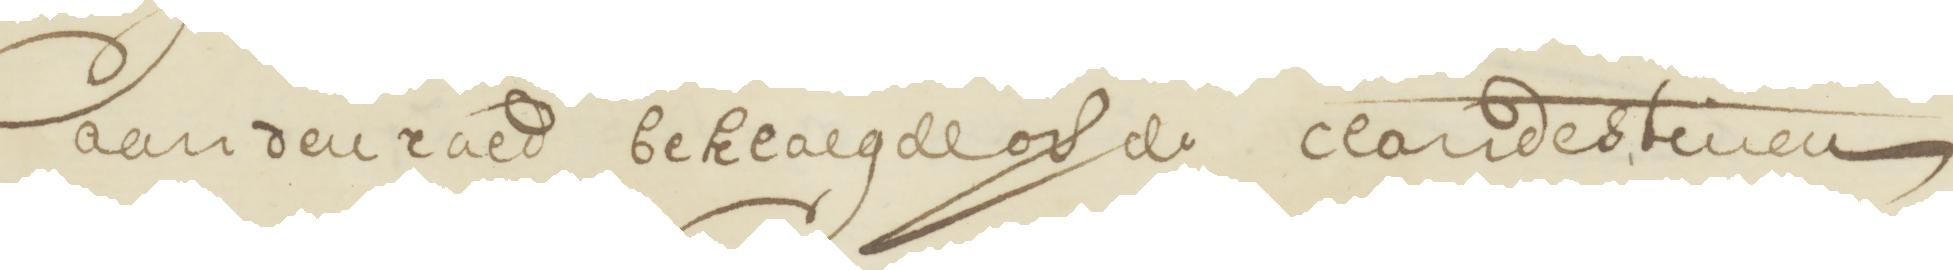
aan den raed beklaegde over de clandestinen
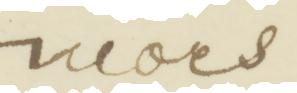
mors
